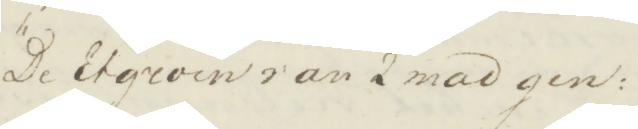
De Etgroen van 2 mad gen:
